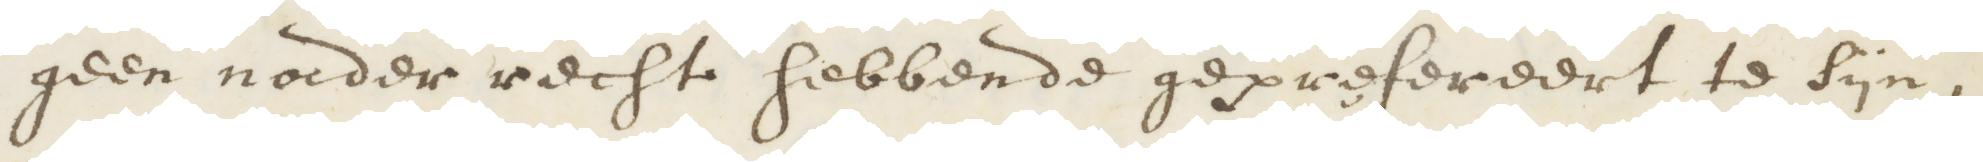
geen nader recht hebbende geprefereert te sijn,
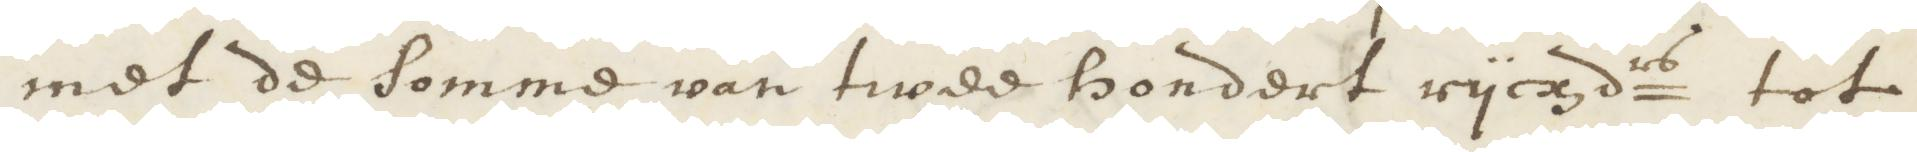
met de somme van twee hondert rijcxd=rs tot
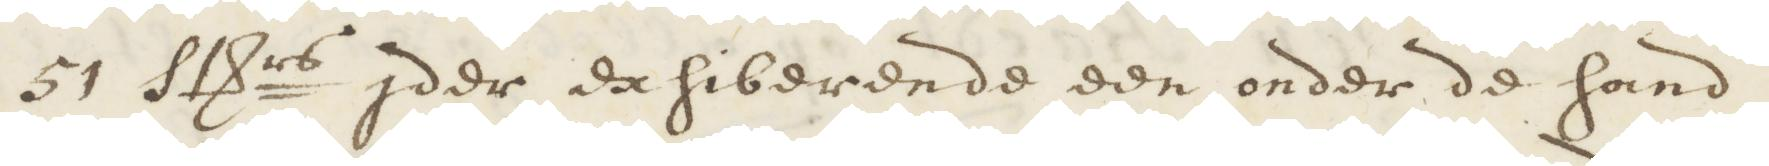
51 stver=rs jder exhiberende een onder de hand
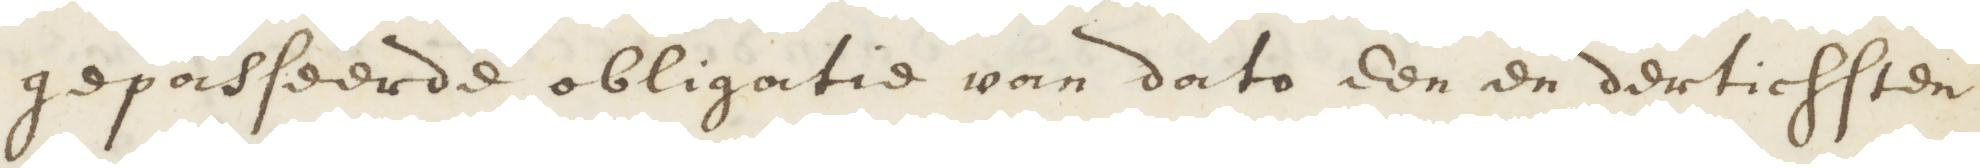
gepasseerde obligatie van dato een en dertichsten
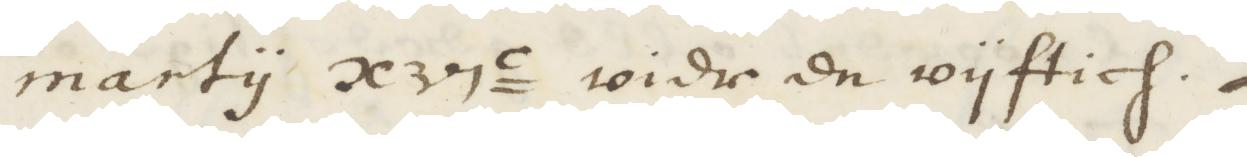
martij xvj=e vier en vijftich.
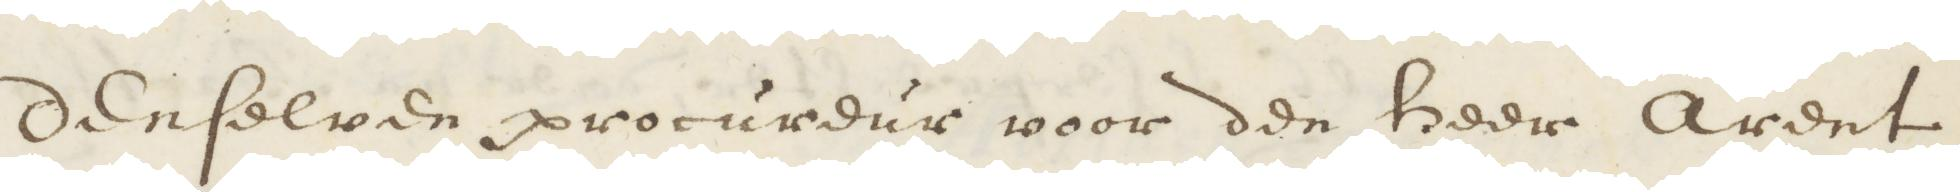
denselven procureur voor den heer arent
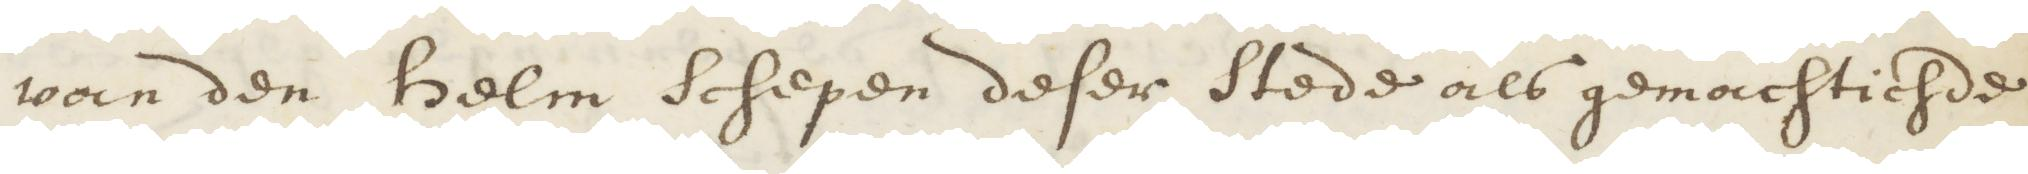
van den helm schepen deser stede als gemachtichde
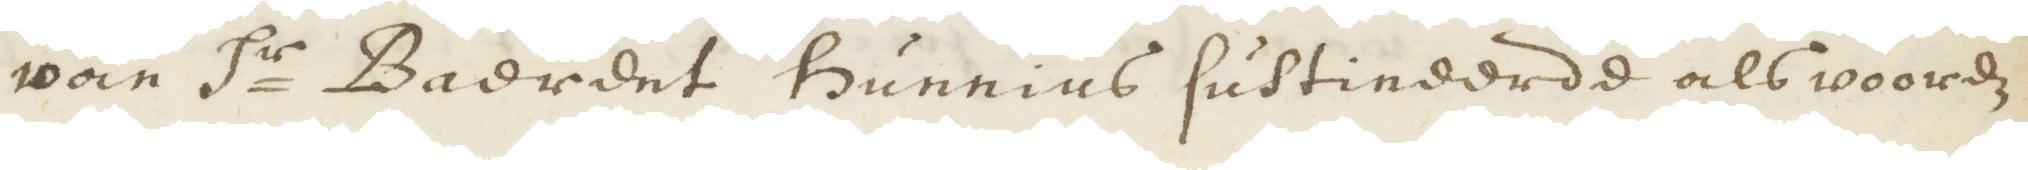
van I=r Baerent hunnius sustineerde als vooren
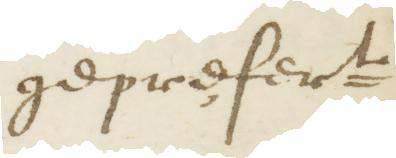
geprefer=t
